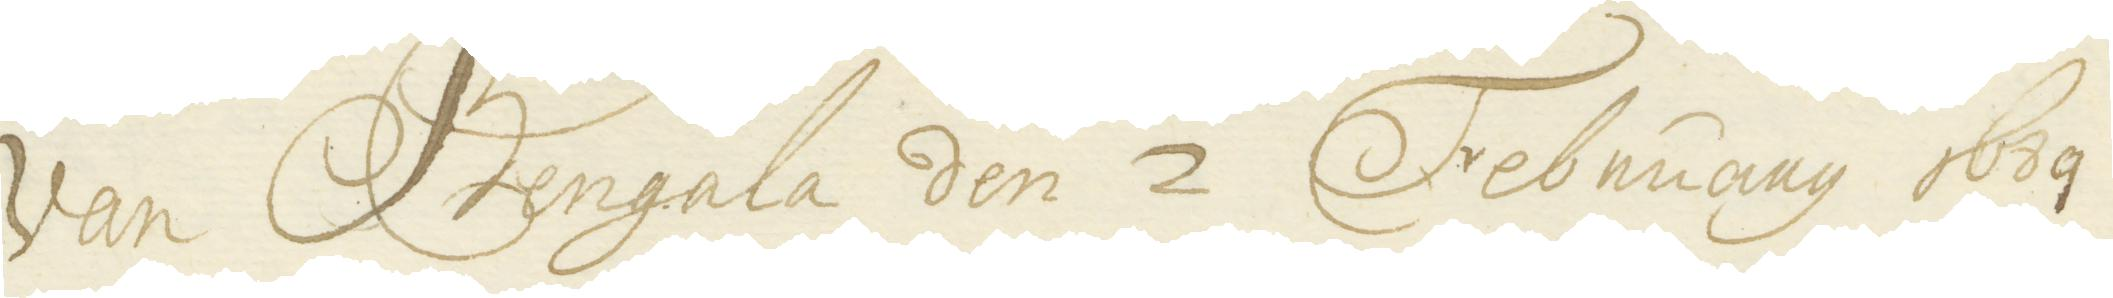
Van Bengala den 2 February 1689
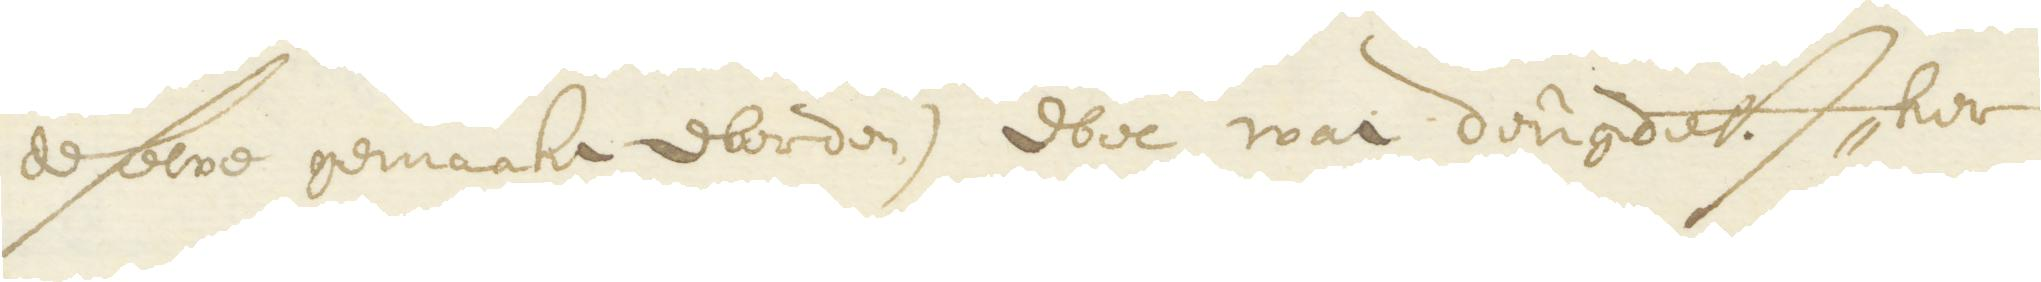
deselve gemaakt werden) wel wat deugdelijk„ker
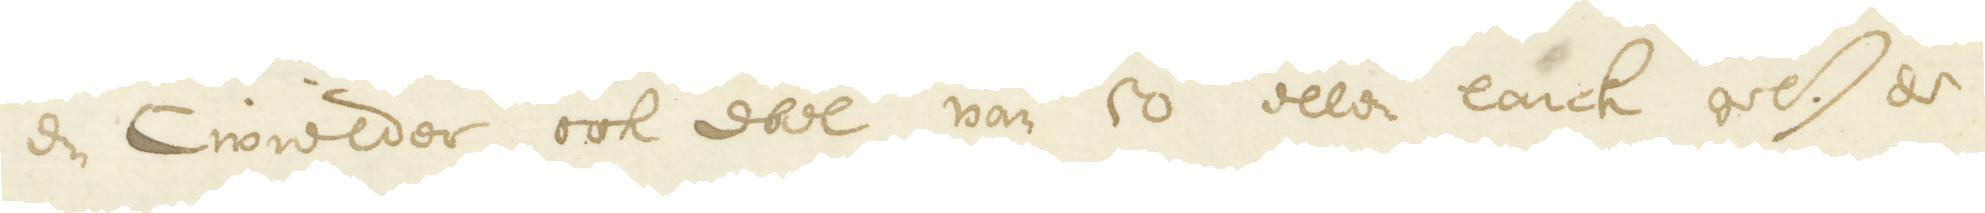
en Cwielder ook wel van 50 ellen lanck gelijk de
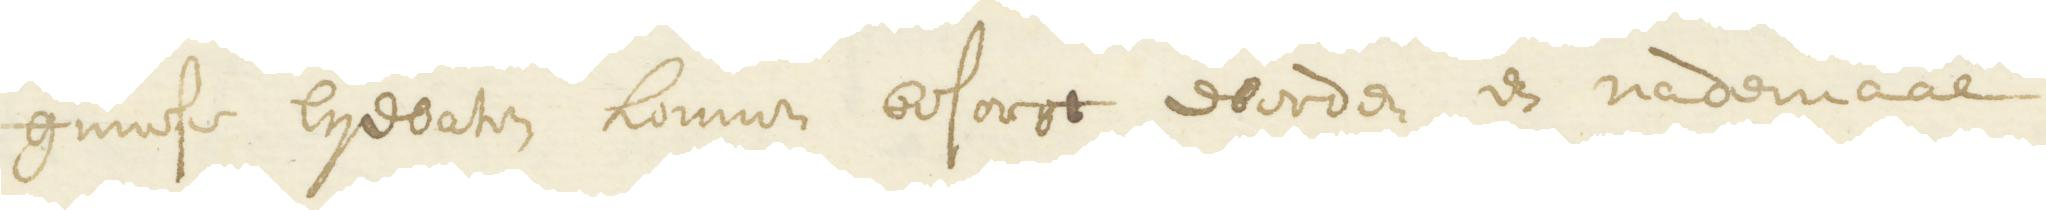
gunese lijwaten konnen besorgt werden en nademaal
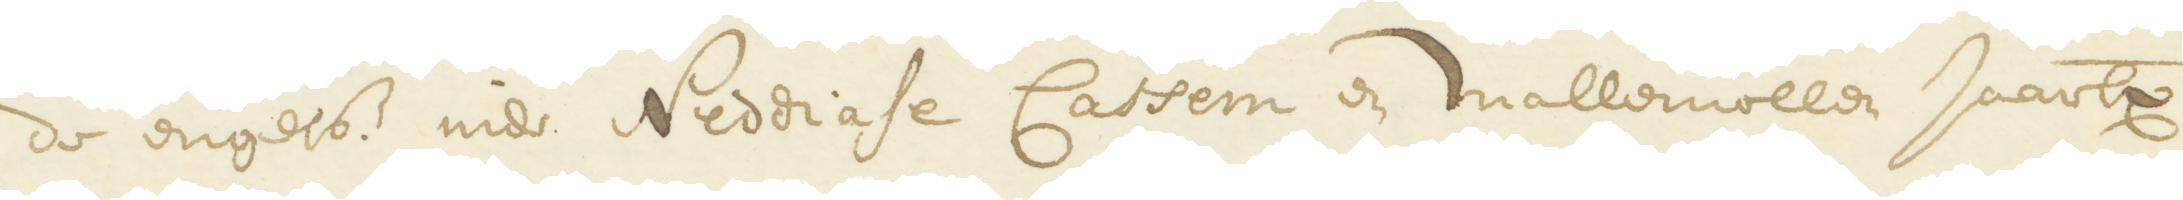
de engels. inde Neddiase Cassem en mallemollen Jaarlijkx
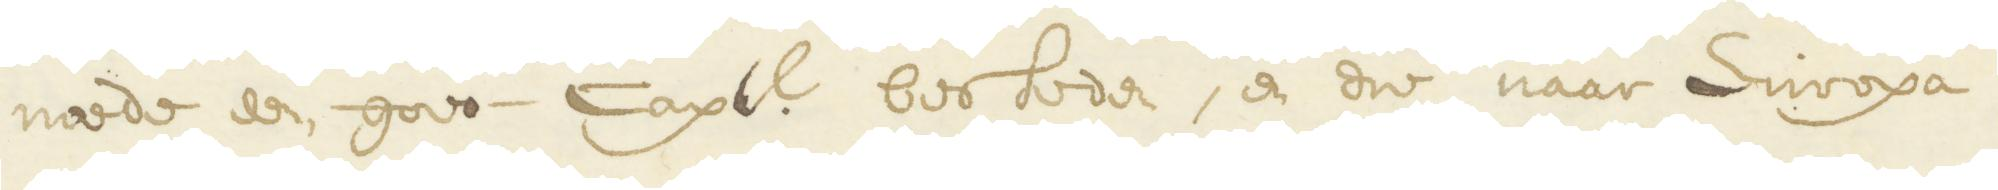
mede een goet Capt.l besteden, en die naar Europa
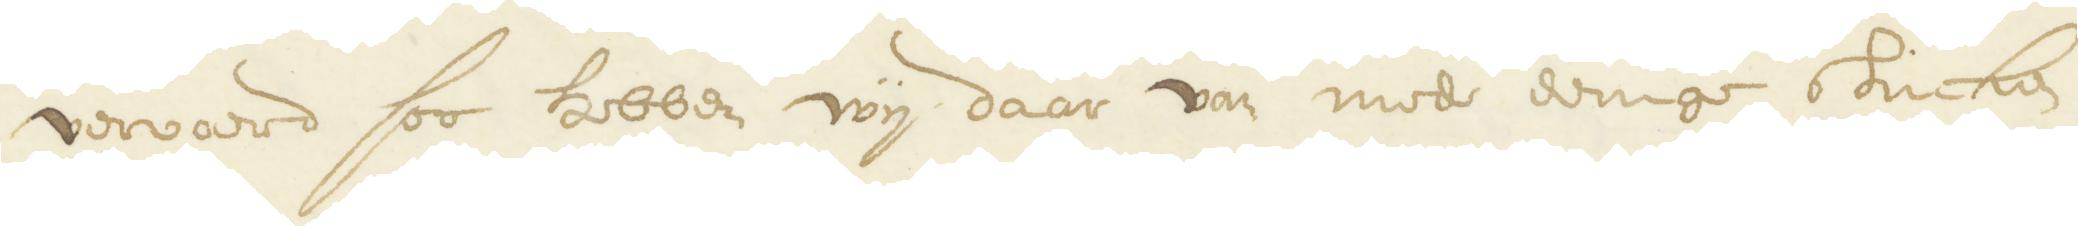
vervoerd soo hebben wij daar van mede eenige stucken
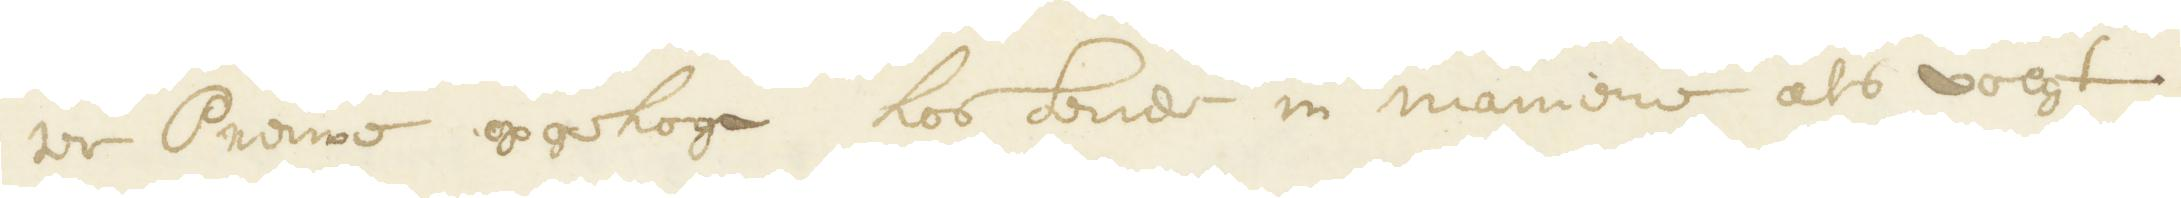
der Preuve opgekogt kostende in maniere als volgt
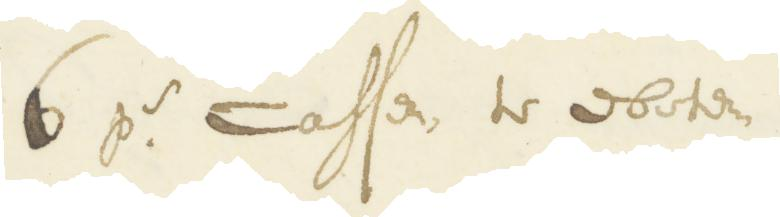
6 p.s Cassen te weten
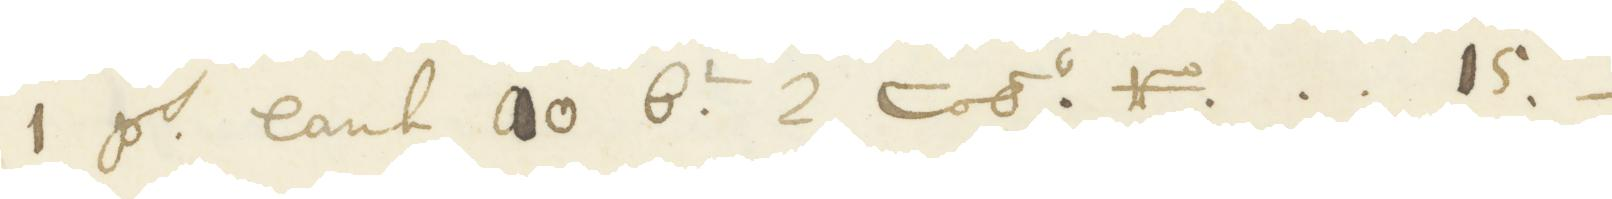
1 p.s lank 40 b.^ 2 cos: ro . . . 15. —
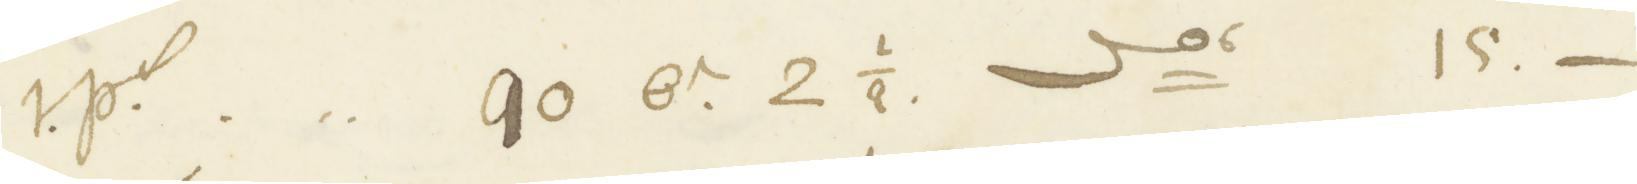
1. p.s . . . 40 b.^ 2 1/4. d=os 15. —
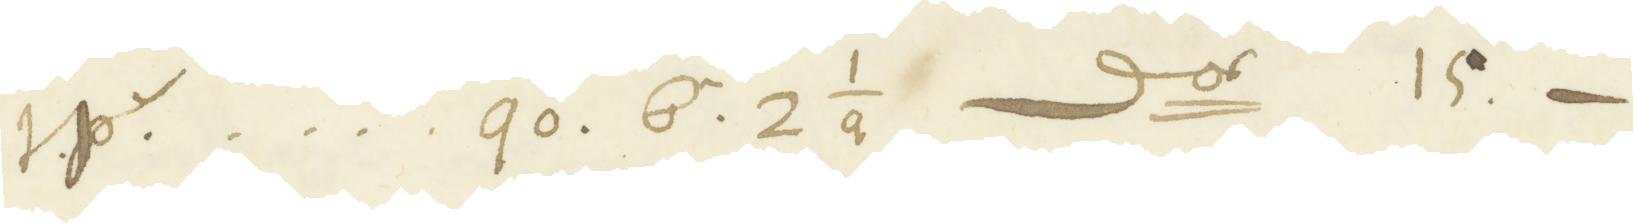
1. p.r . . . . . 40.b.^ 2 1/4 d=os 15. —
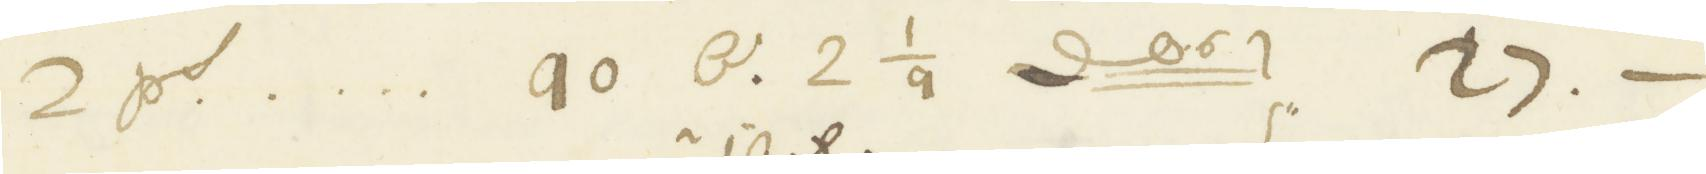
2 p.s . . . . 40 b. 2 1/4 d=os ) 27.—
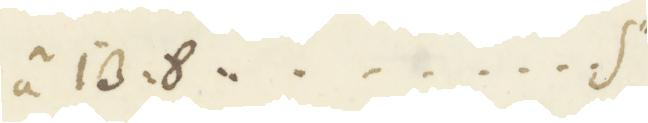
â 13.8. . . . . . . )
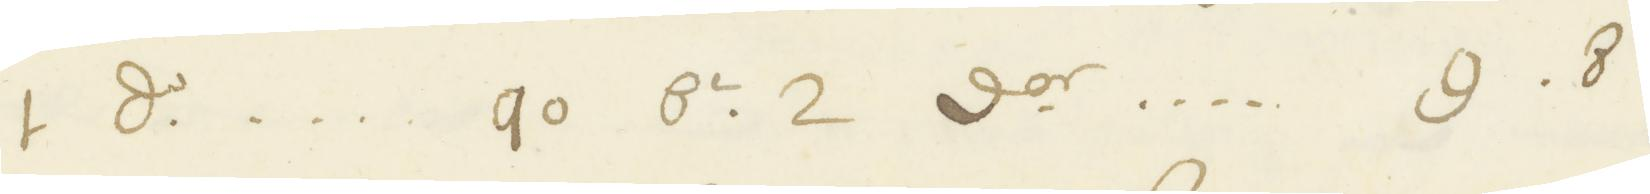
1 d.o . . . . 40 b^. 2 dos - - - - 9 . 8
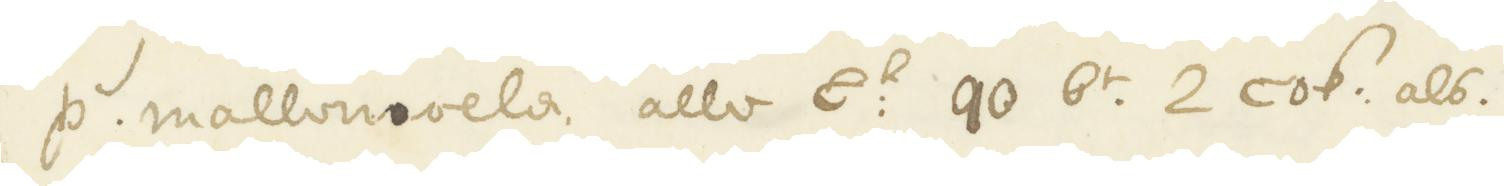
p.s mallemollen alle b:k 40 b:t 2 cos: als.
